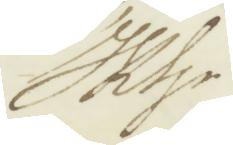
IKSjr
